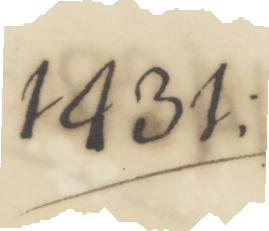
1431:
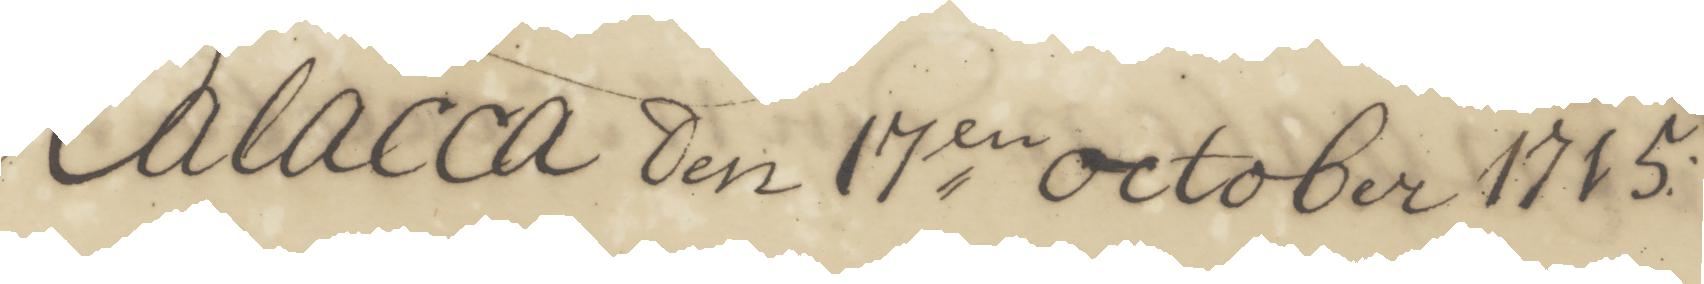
Malacca den 17„en October 1715:
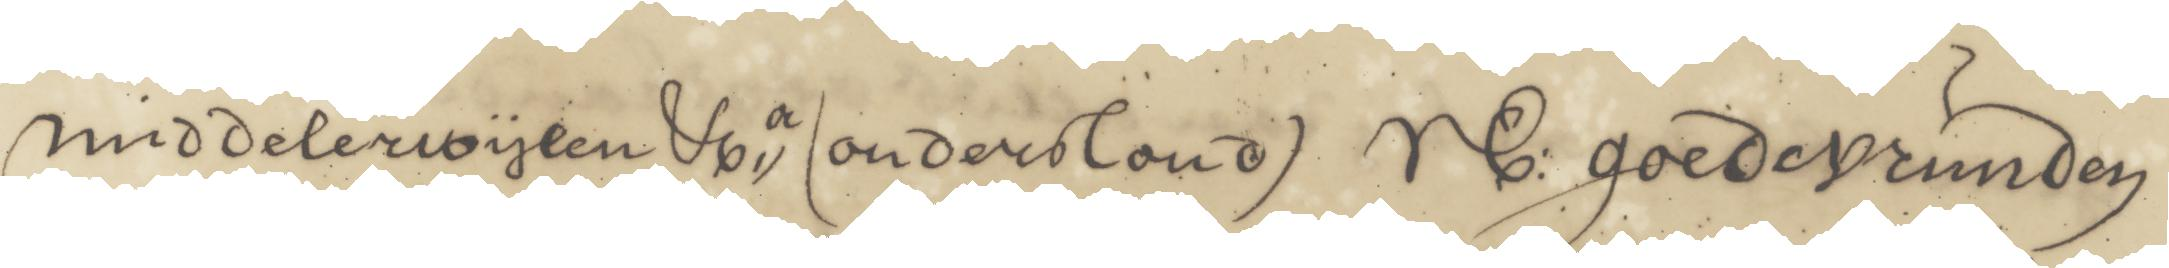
middelerwijlen verb„de (onderstond) UE: goedevrunden
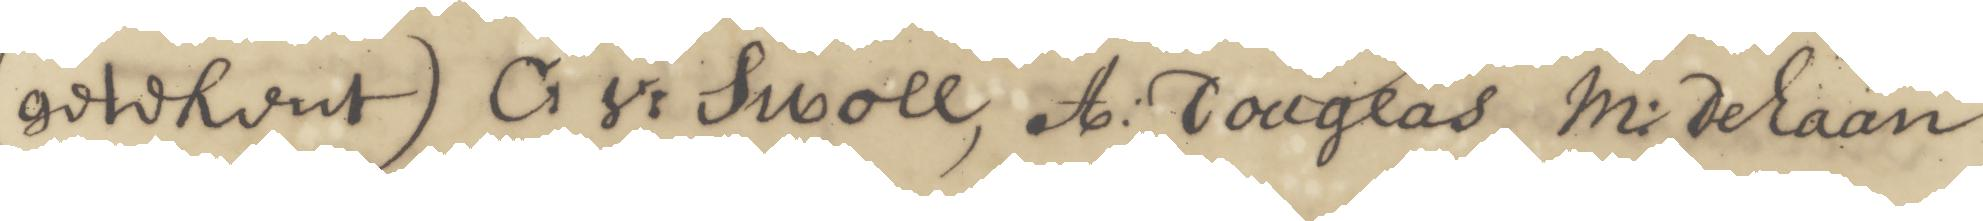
(getekent) C: v: Swoll, A: Douglas, m: dehaan
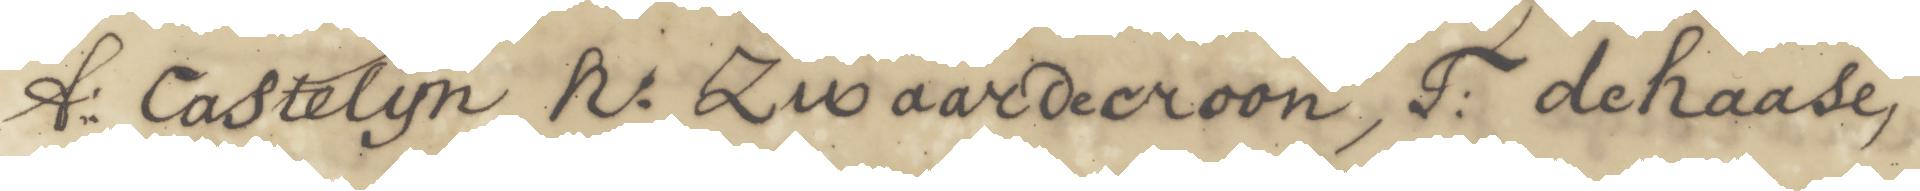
A: Castelijn, H: Zwaardecroon, T: dehaase,
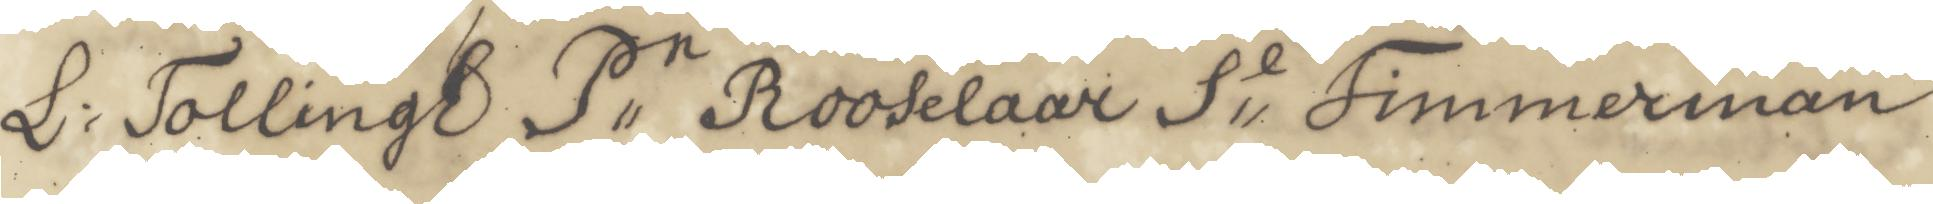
L: Tollingh P:r Rooselaar S:e Timmerman
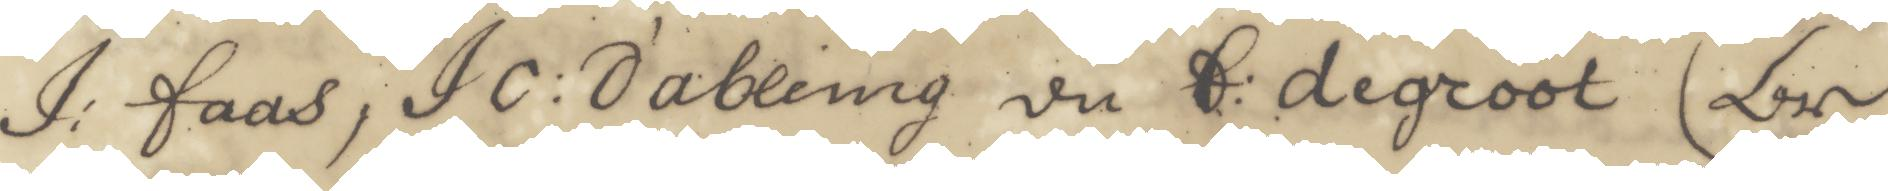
I: faas, Ic: d'ableing en b: degroot (ter
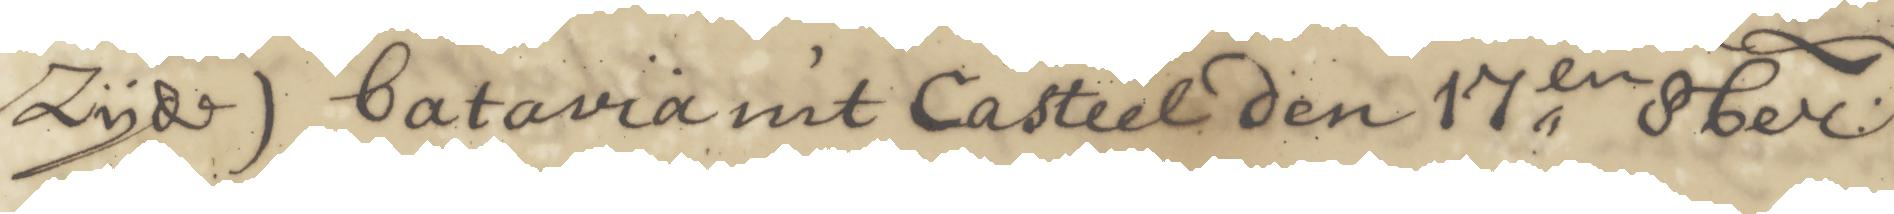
Zijde) batavia in’t Casteel den 17:en 8ber:
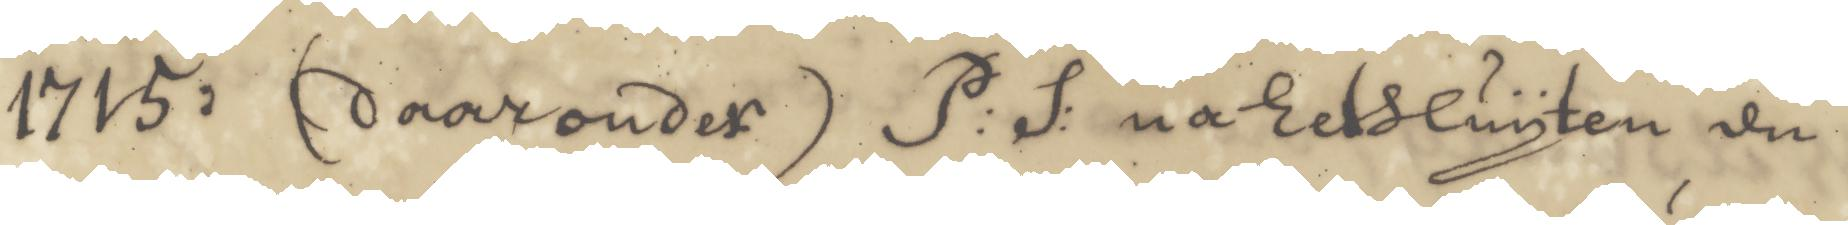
1715: (daaronder) P:S: na hetsluijten en
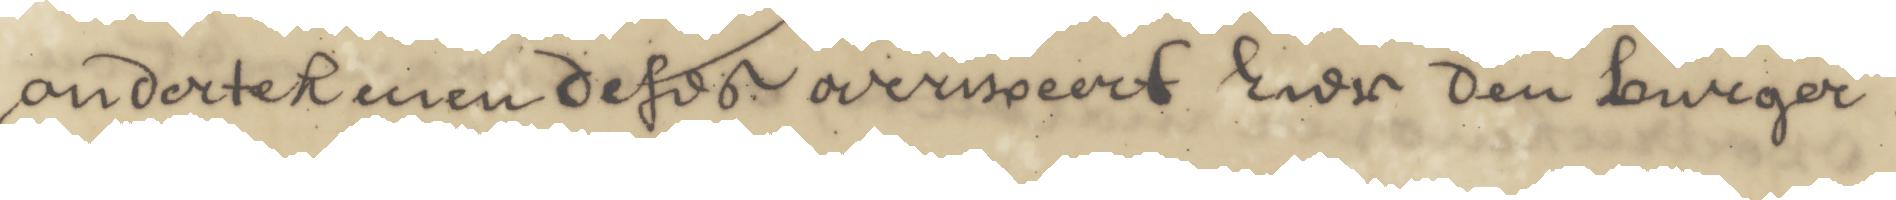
ondertekenen deses arriveert hier den burger
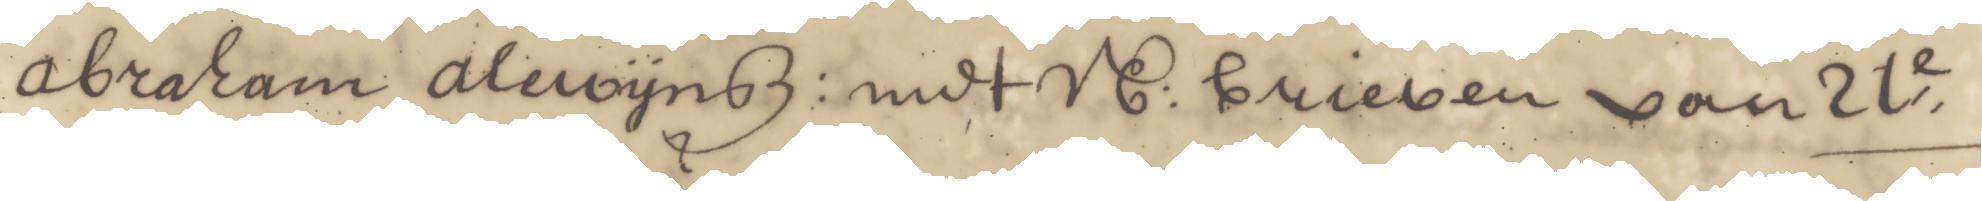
abraham alewijns: met UE. brieven van 21„e
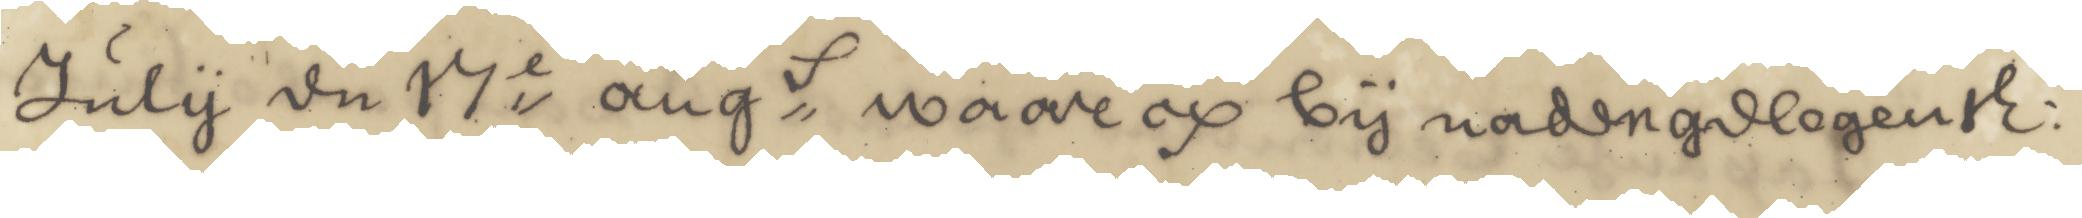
Julij en 17„e aug„s waar op bij nadergelegenth:t
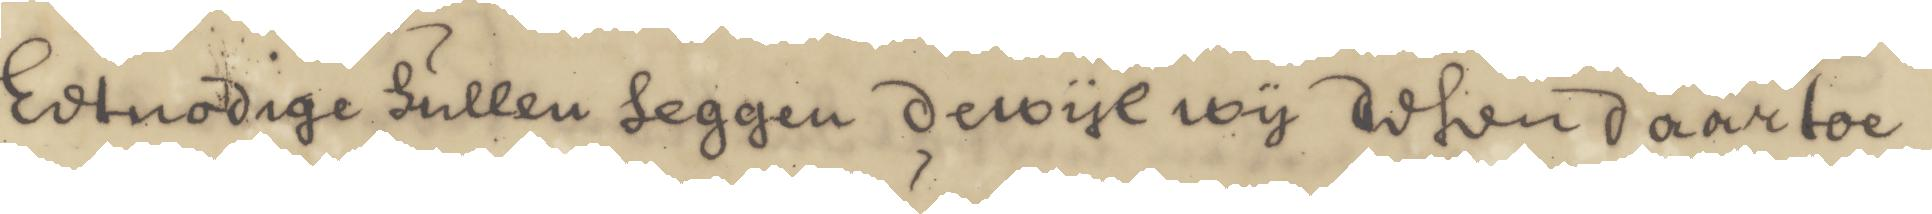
hetnodige sullen seggen dewijl wij desen daartoe
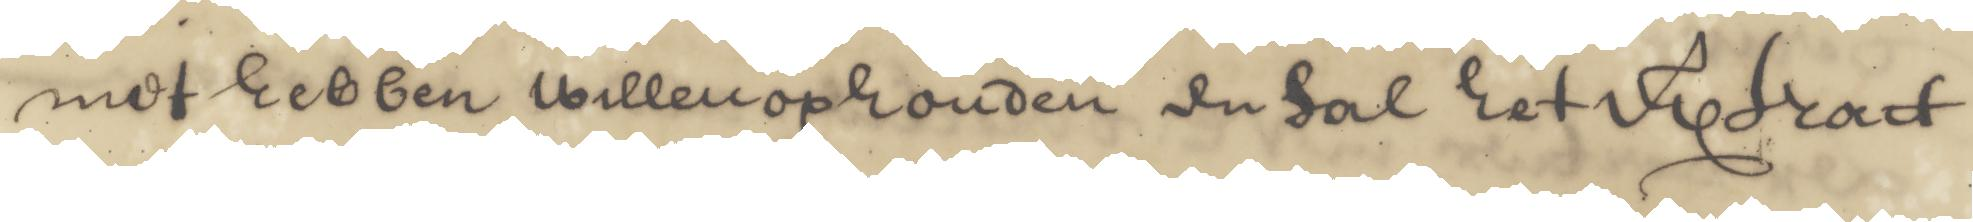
niet hebben willen ophouden en sal het Extract
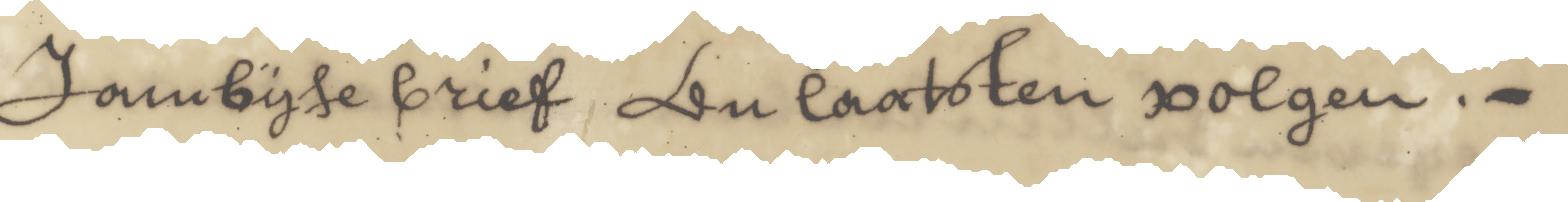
Jambijse brief ten laatsten volgen.-
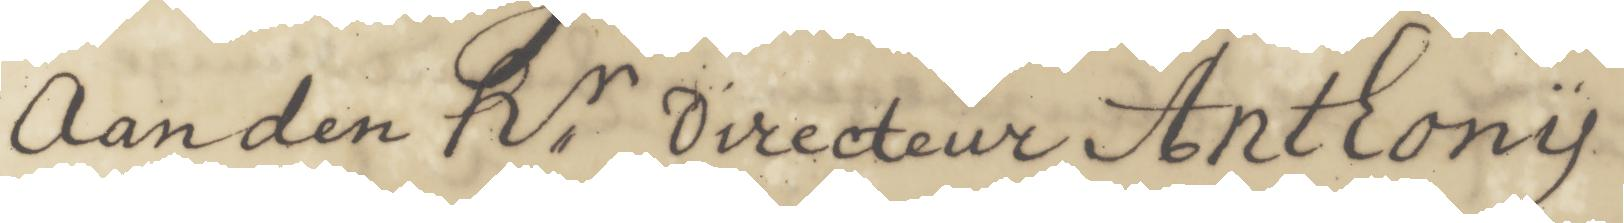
Aan den H:r directeur Anthonij
